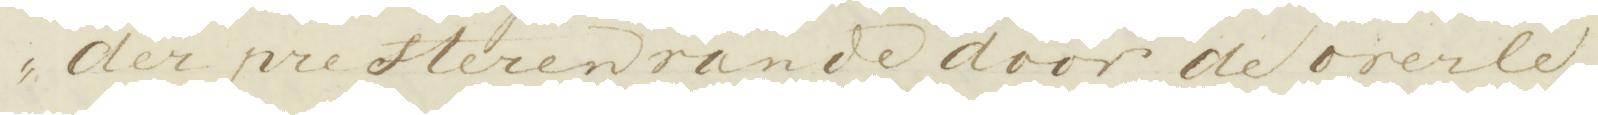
„der presteren van de door de overle
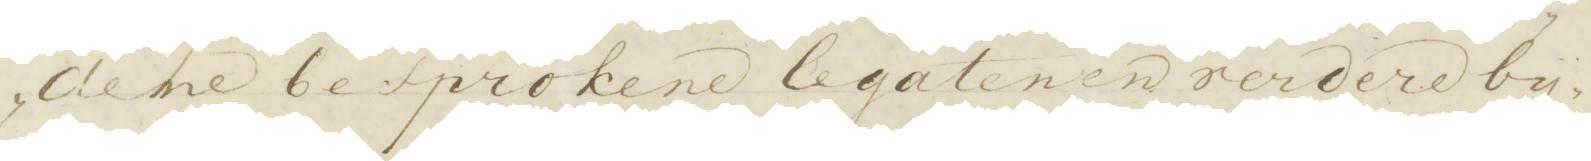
„dene besprokene legaten en verdere bij„
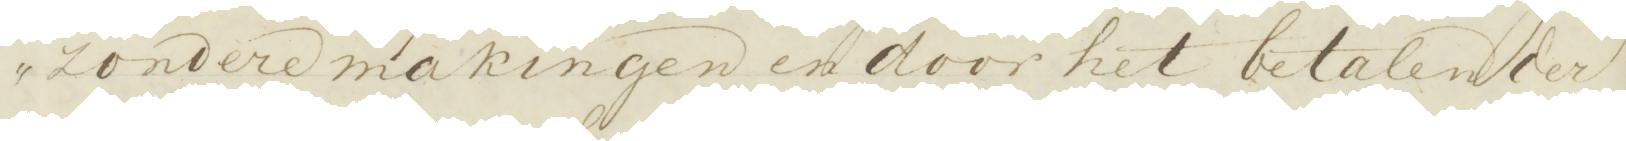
„zondere makingen en door het betalen der
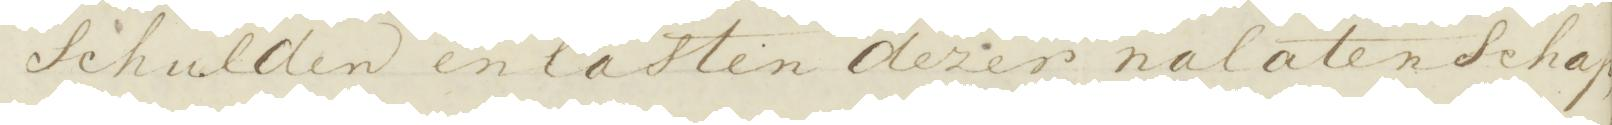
schulden en lasten dezer nalatenschap
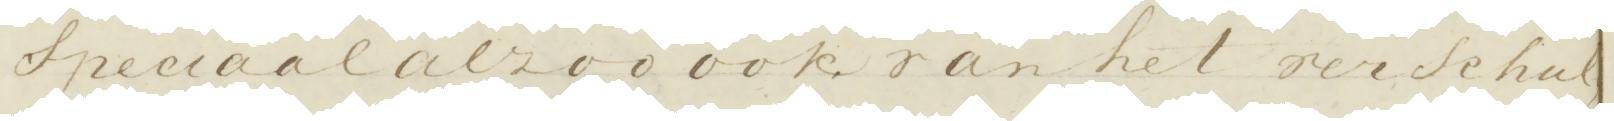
Speciaal alzoo ook van het verschul
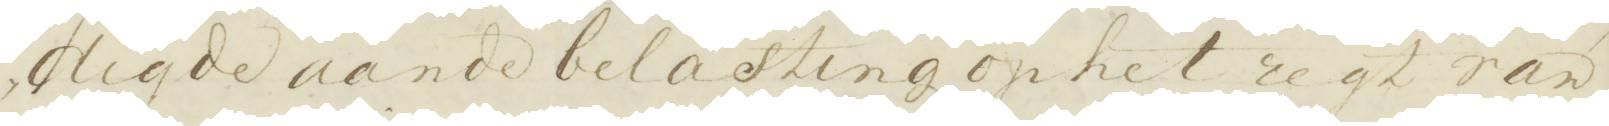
„digde aan de belasting op het regt van
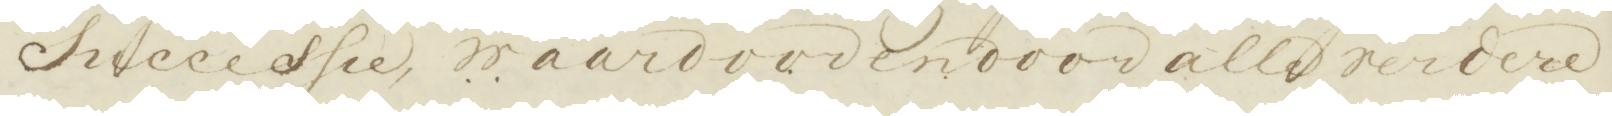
successie, waardoor en door alle verdere
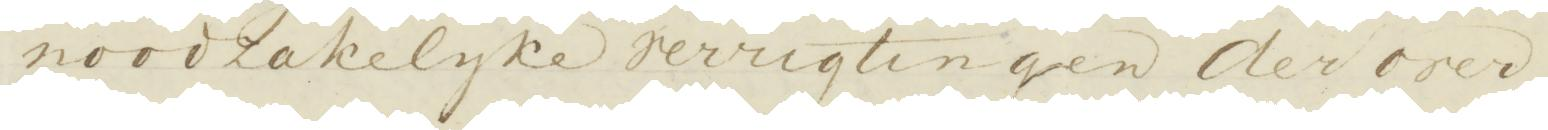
noodzakelyke verrigtingen der over
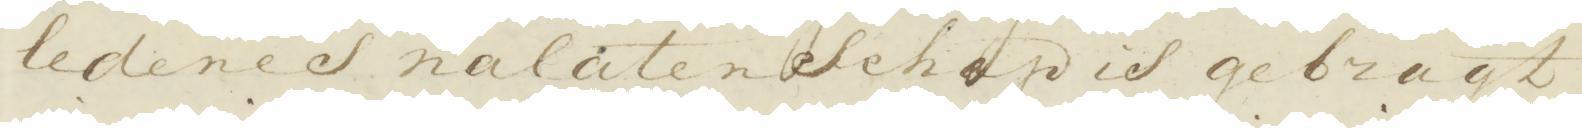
ledenes nalatenschap is gebragt
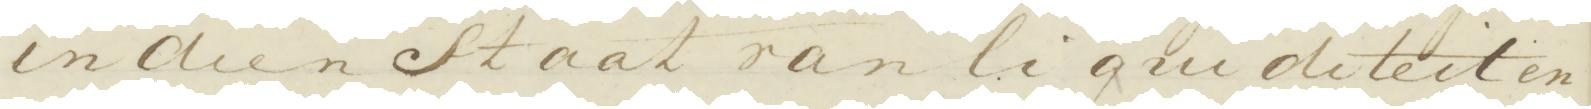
in dien staat van liquiditeiten
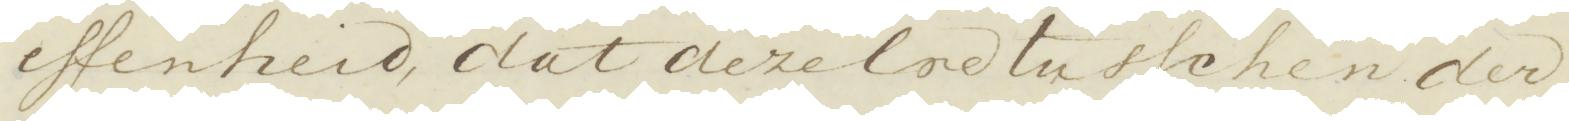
effenheid, dat dezelve tusschen der
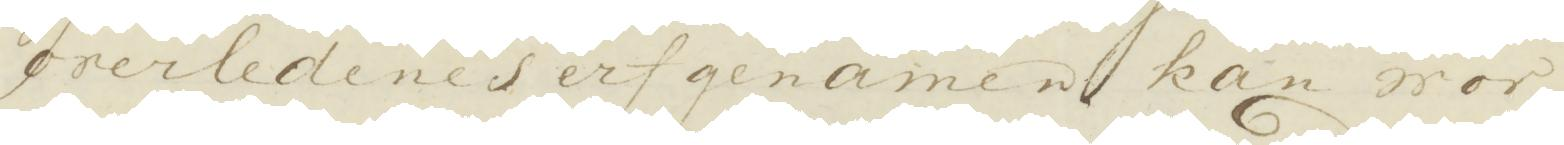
overledenes erfgenamen kan wor
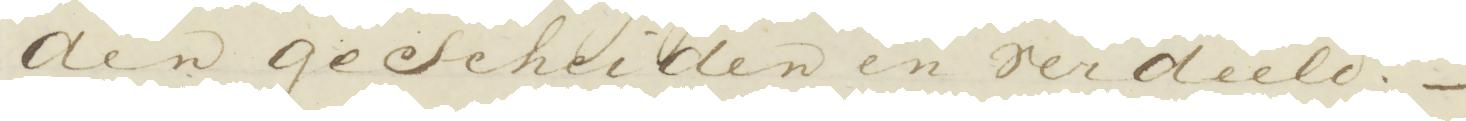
den gescheiden en verdeeld.-
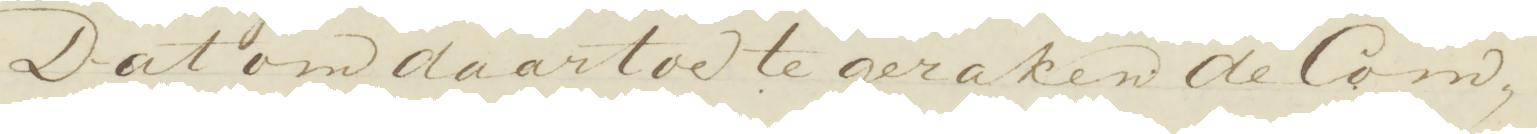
Dat om daartoe te geraken de Com„
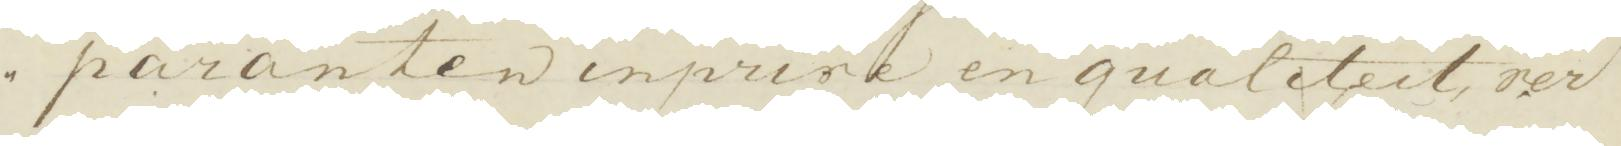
„ paranten inprive en qualiteit, ver
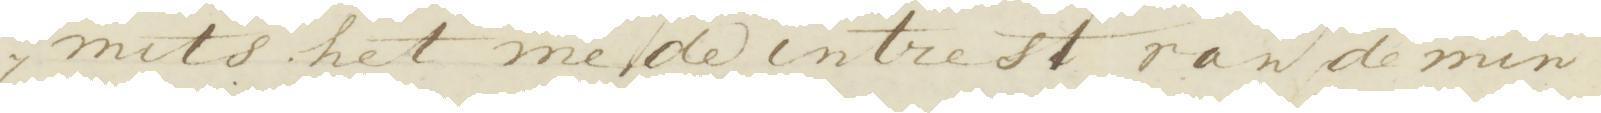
„ mits het mede intrest van de min
